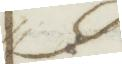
„ 9
